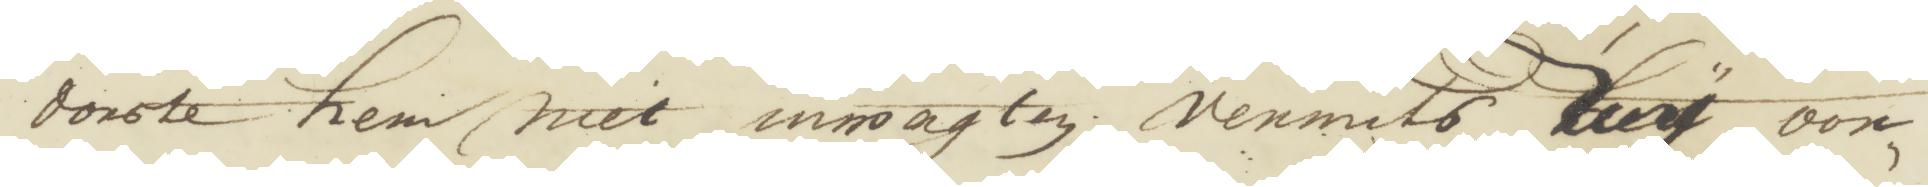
dorste hem, niet inwagten; vermits wij oor,
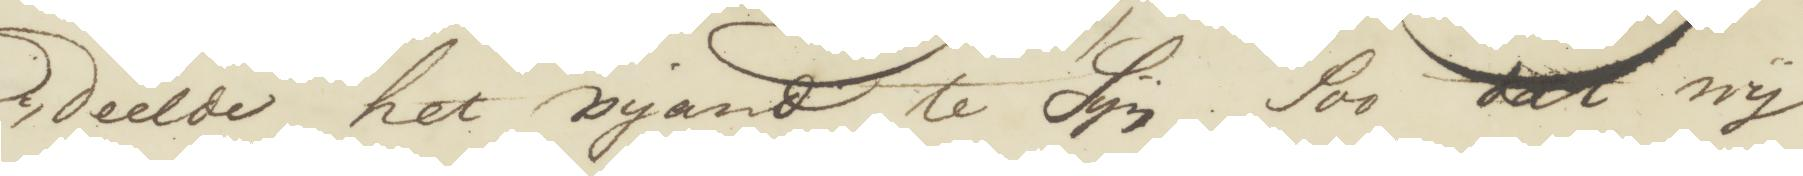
„deelde het vijand te sijn, soo dat wij
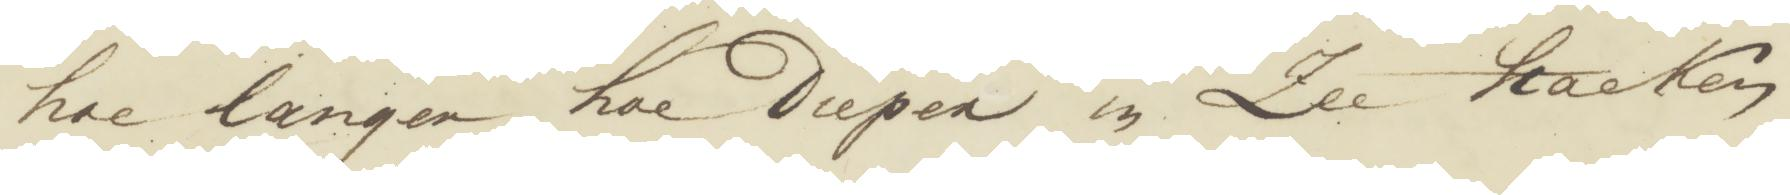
hoe langer hoe dieper in zee staeken
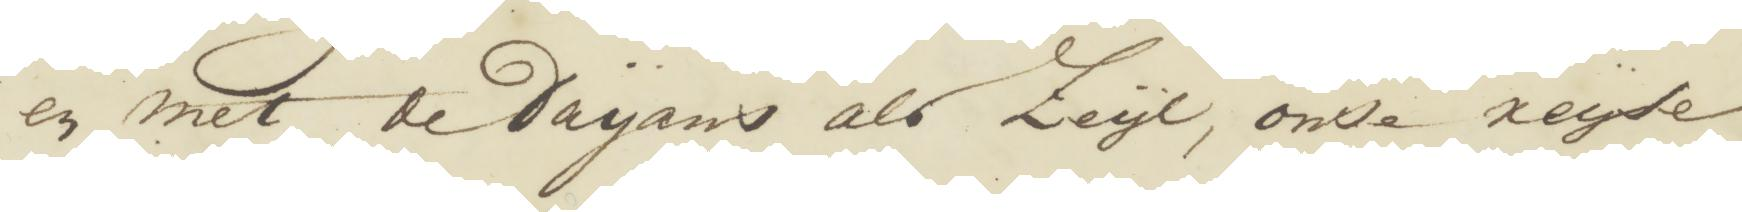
en met de daijans als Zeijl, onse reijse,
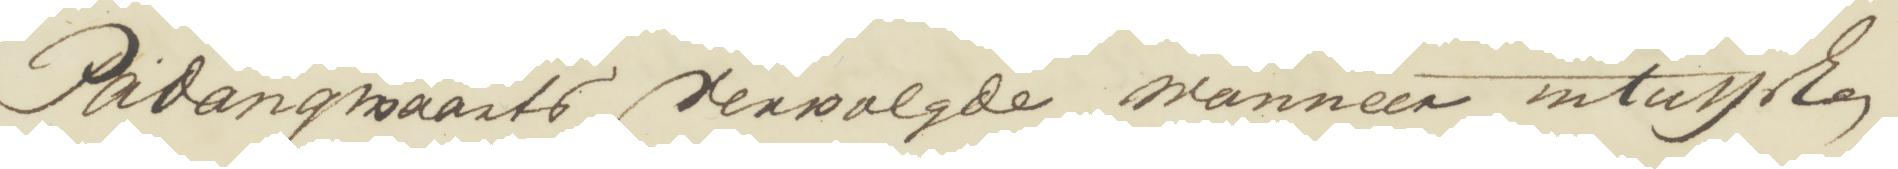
Padangwaarts vervolgde wanneer intusschen
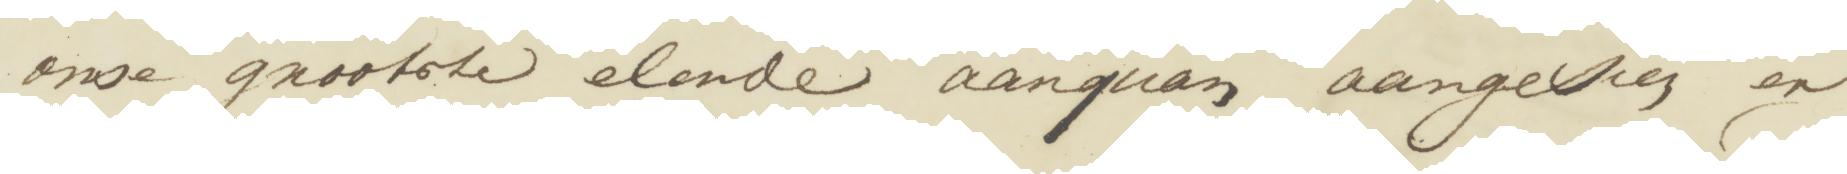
onse grootste elende aanquam aangesien ’er
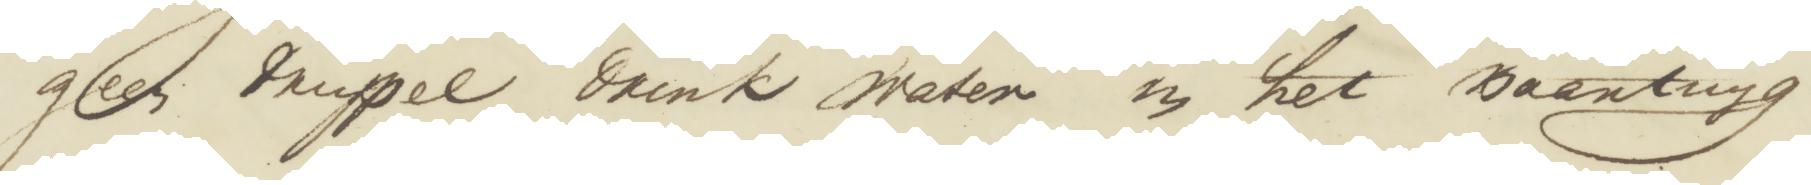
geen druppel drink water in het vaartuijg
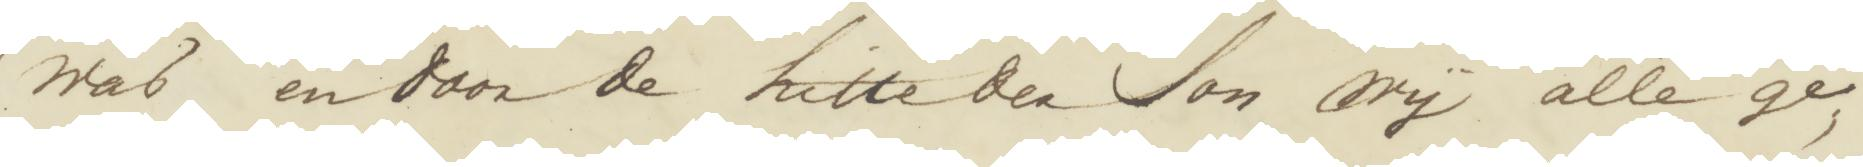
was en door de hitte der son wij alle ge„
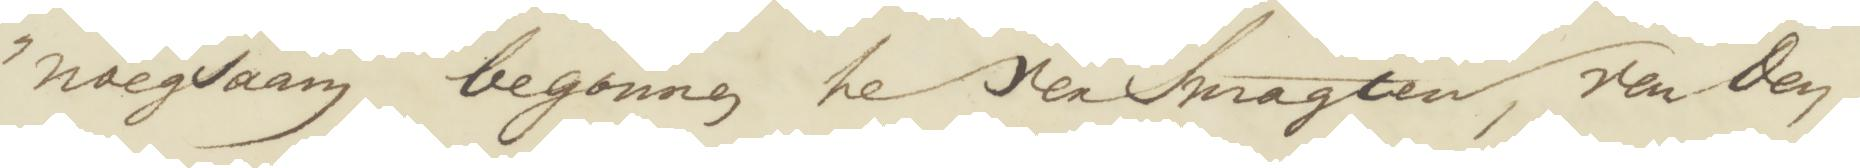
”noegsaam begonnen te versmagten, van den
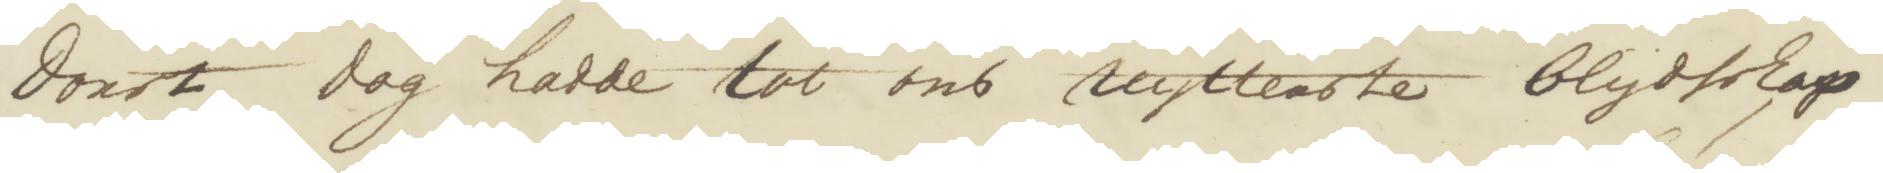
dorst dog hadde tot ons uijtterste blijdschap
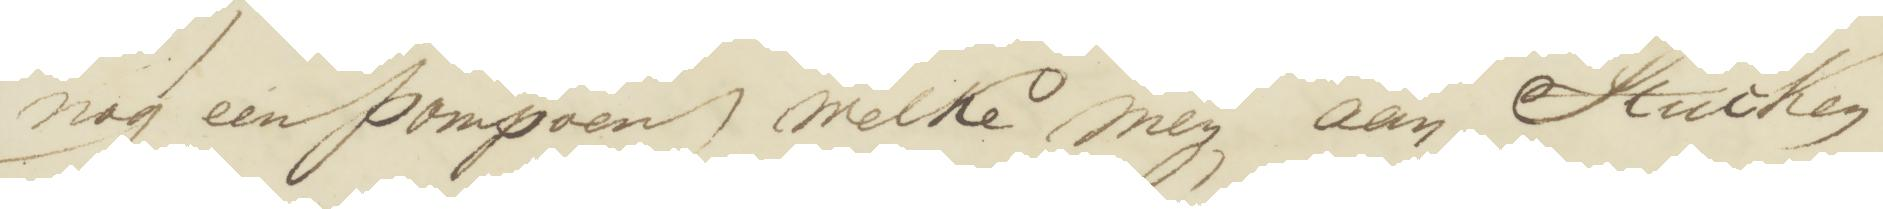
nog een pompoen, welke men aan Stucken
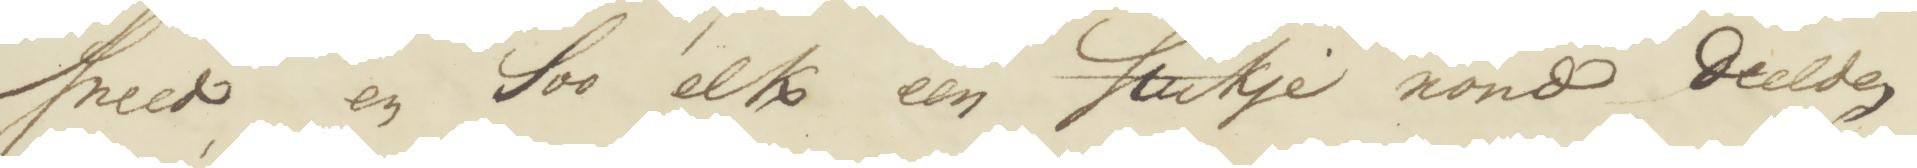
sneed, en soo elk een stukje rond deelden
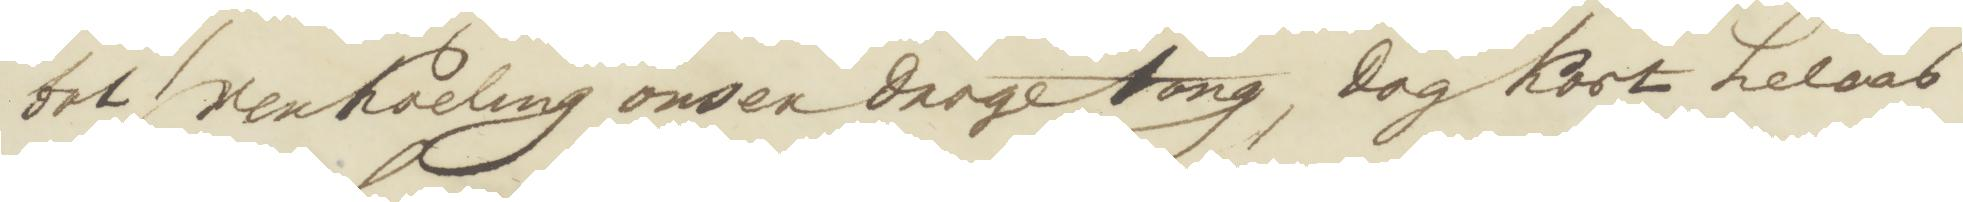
tot verkoeling onser droge tong, dog kost helaas
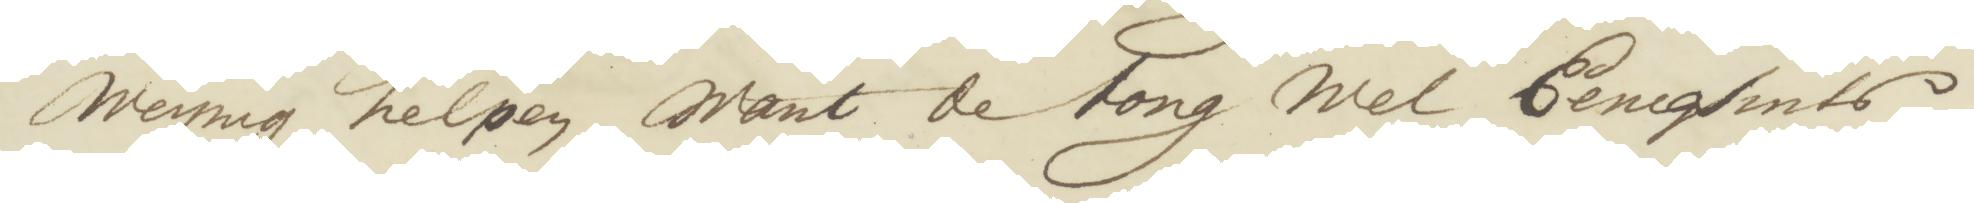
weijnig helpen, want de tong wel Eenigsints
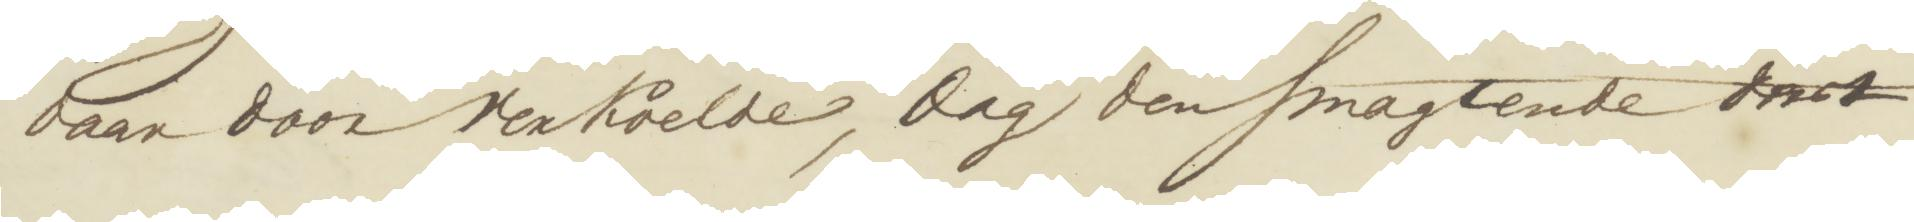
daar door verkoelde, dog den smagtende dorst
